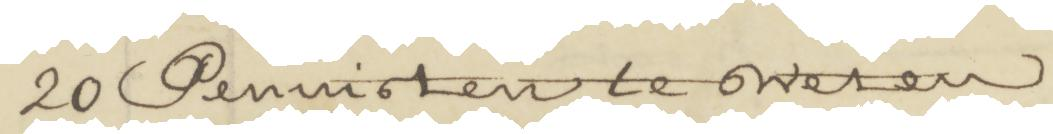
20 Pennisten te weten
